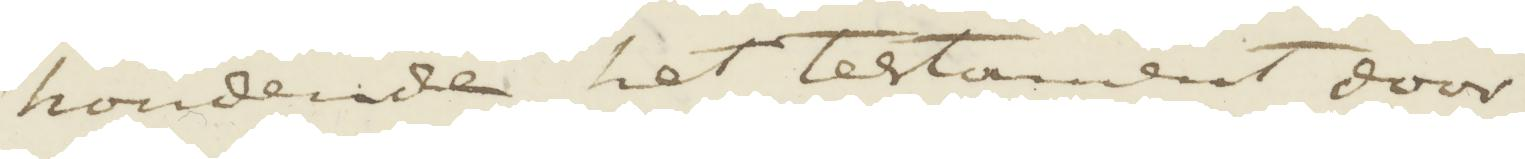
houdende het testament door
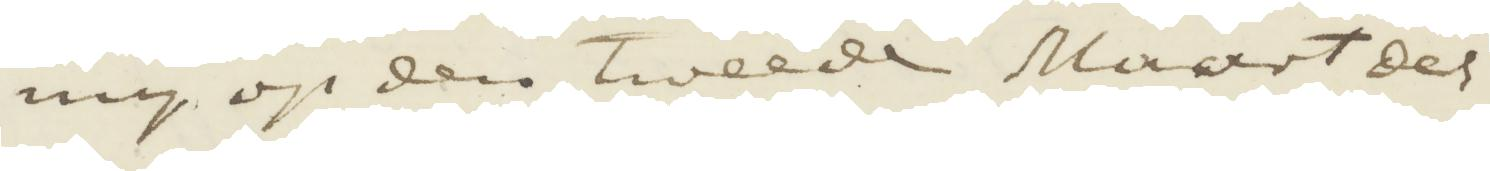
my op den tweede Maart des
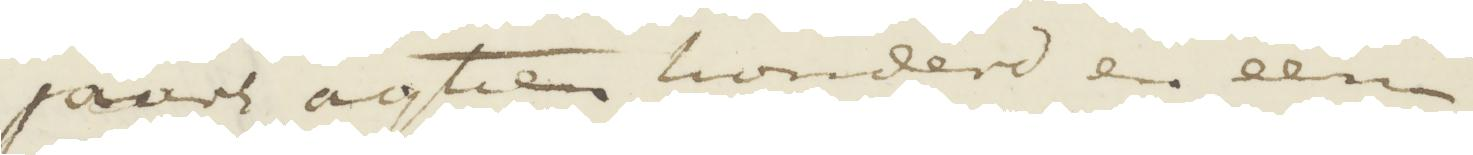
jaars agtien honderd en een
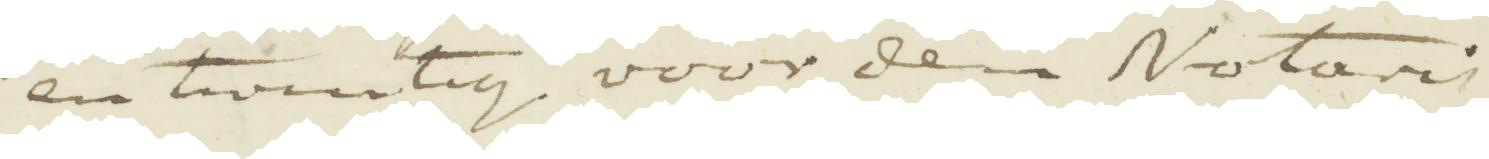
en twintig voor den Notaris
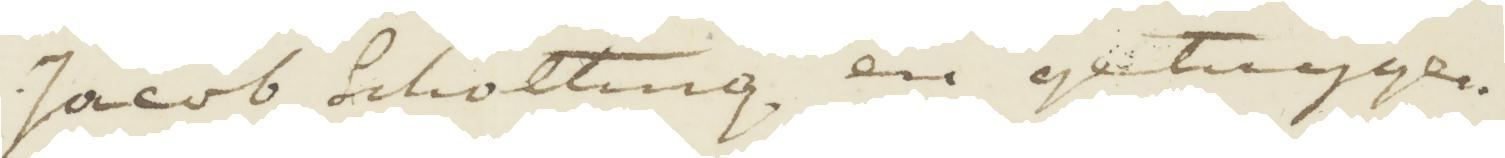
Jacob Scholting en getuygen.
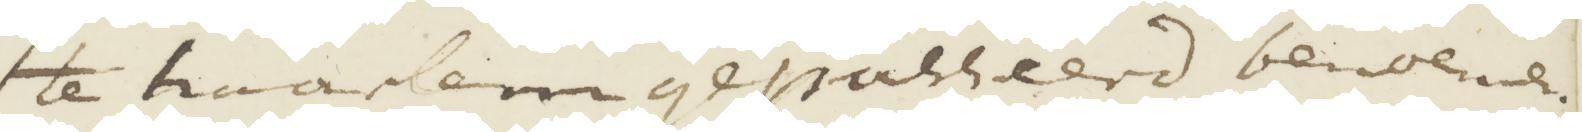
te Haarlem gepasseerd benoeme.
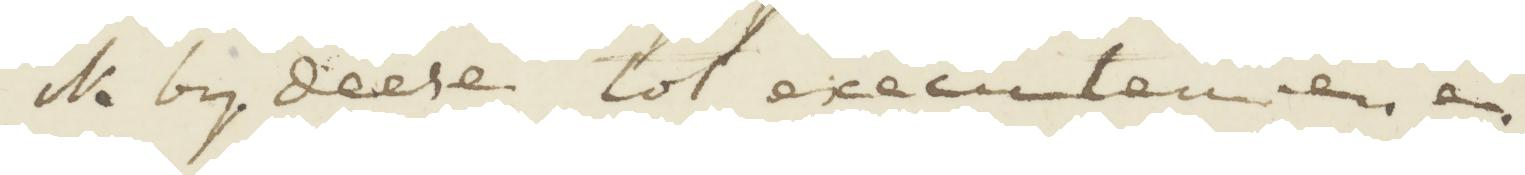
ik by deese tot executeuren en
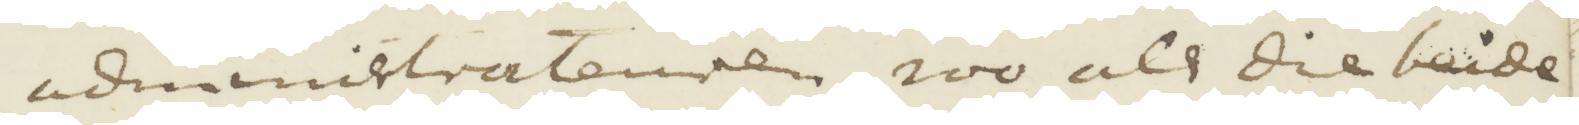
administrateuren, zoo als die beide
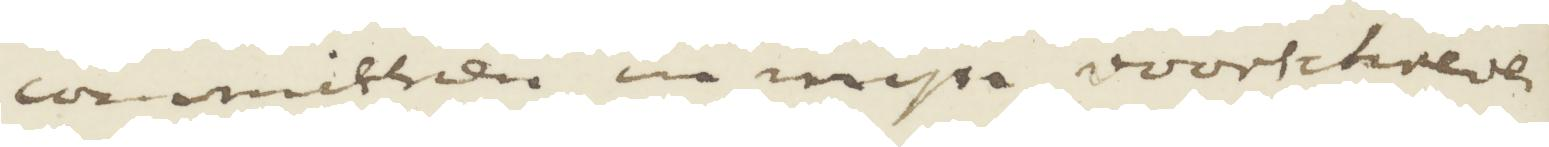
commissien in myn voorschreve
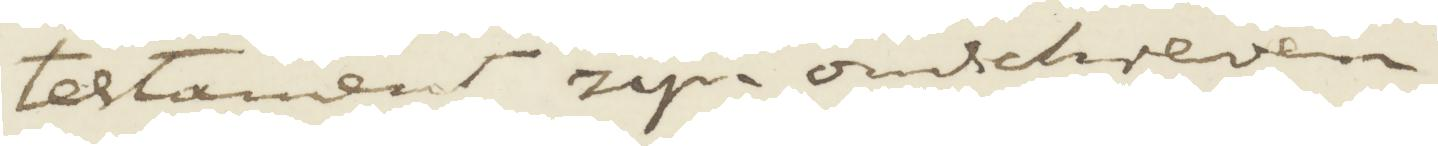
testament zyn omschreven
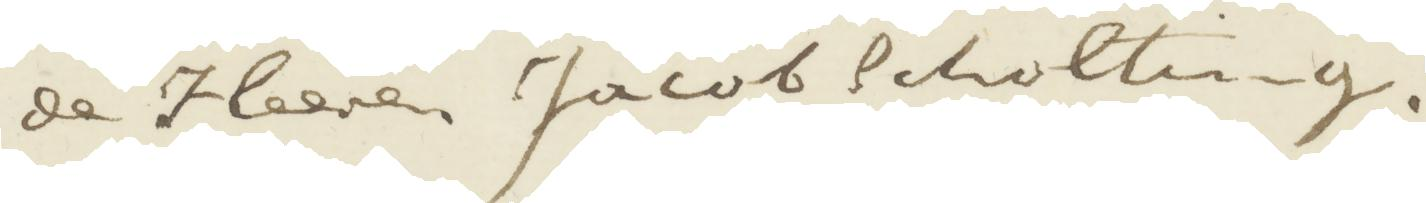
de Heeren Jacob Scholting,
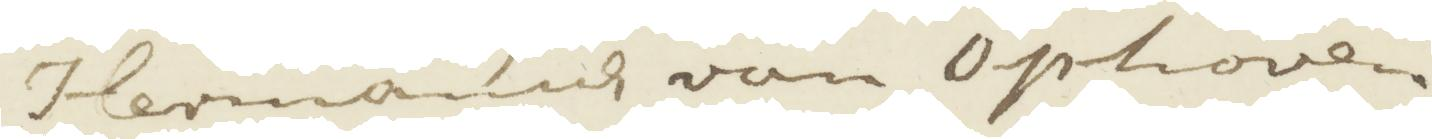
Hermanus van Ophoven,
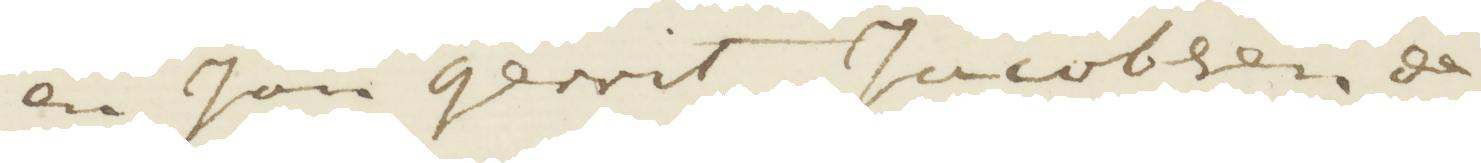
en Jan Gerrit Jacobsen, de
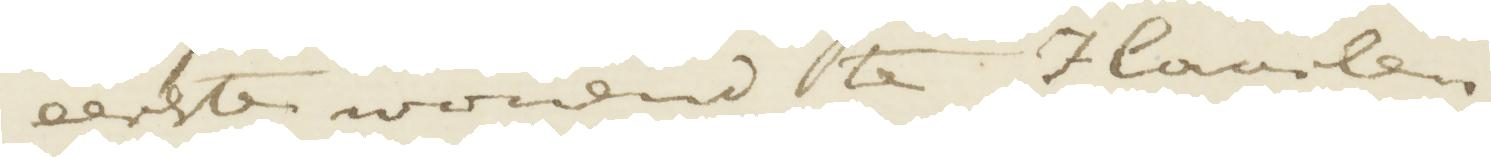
eerste wonend te Haarlen,
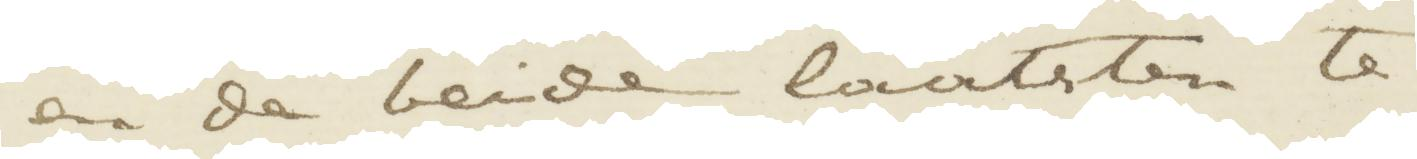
en de beide laatsten te
